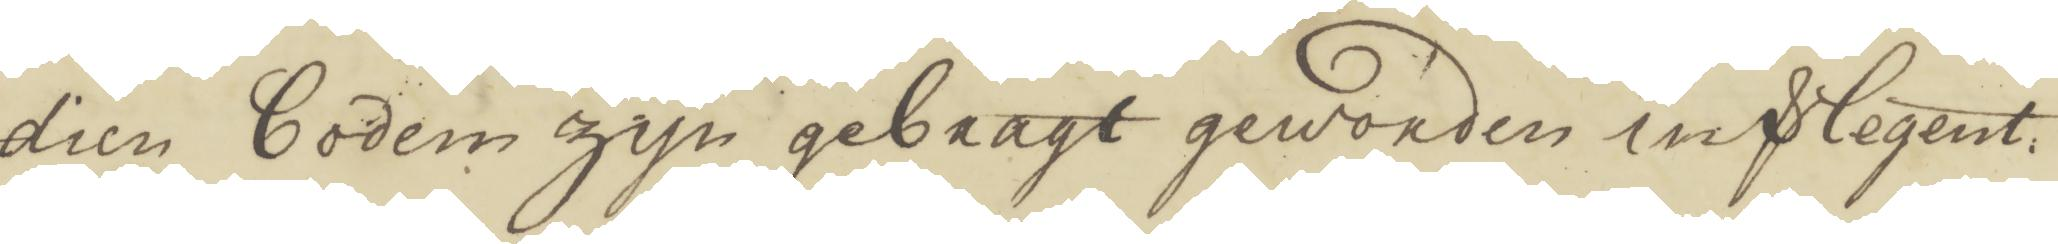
dien bodem zijn gebragt geworden in verlegent:
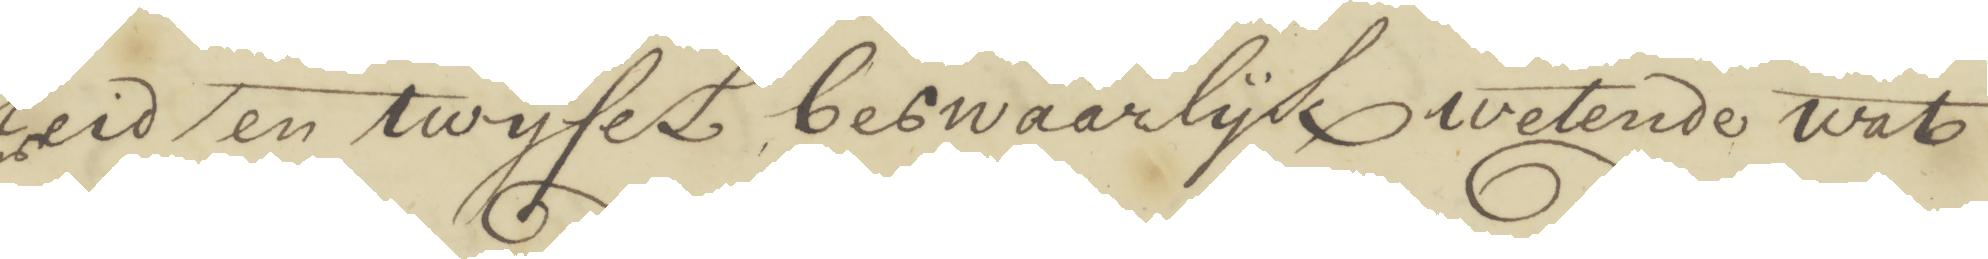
heid en twijfel beswaarlijk wetende wat
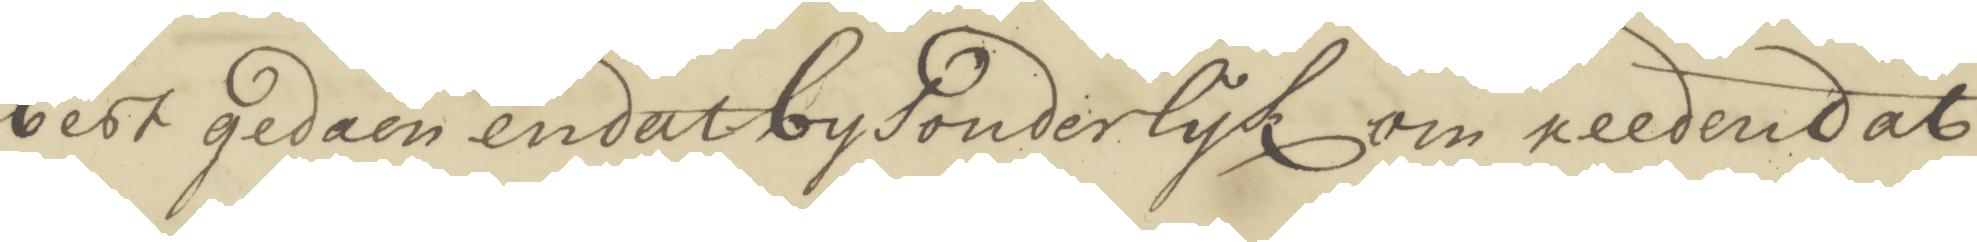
best gedaen en dat bysonderlijk om reeden dat
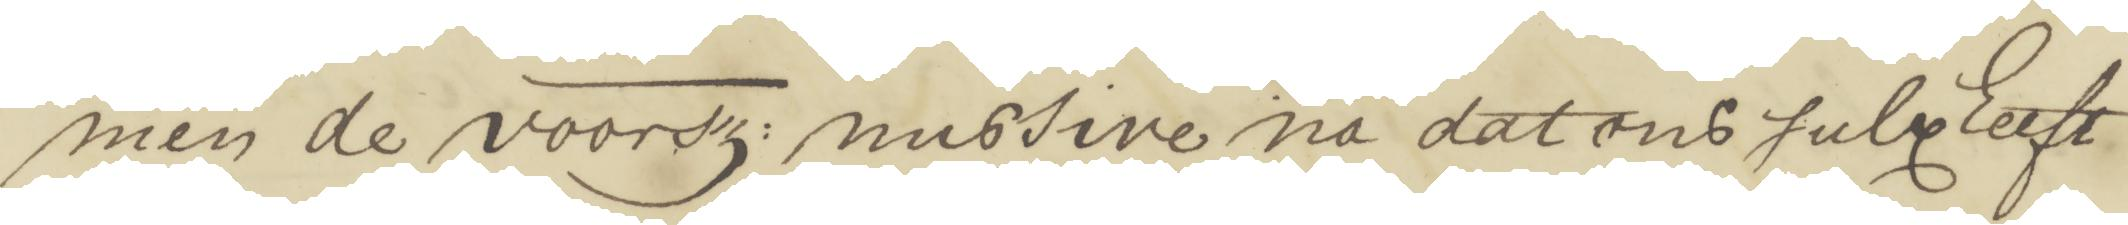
men de voorsz: missive na dat ons sulx heeft
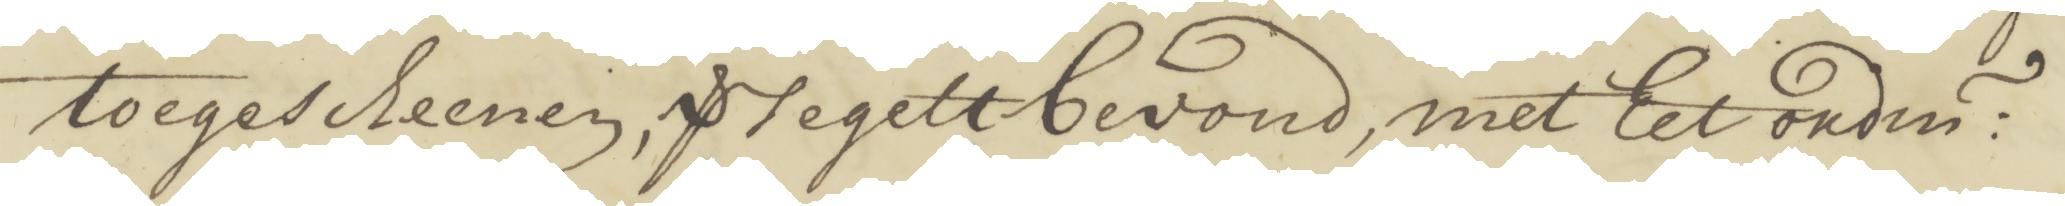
toegescheenen, versegelt bevond, met het ordin:
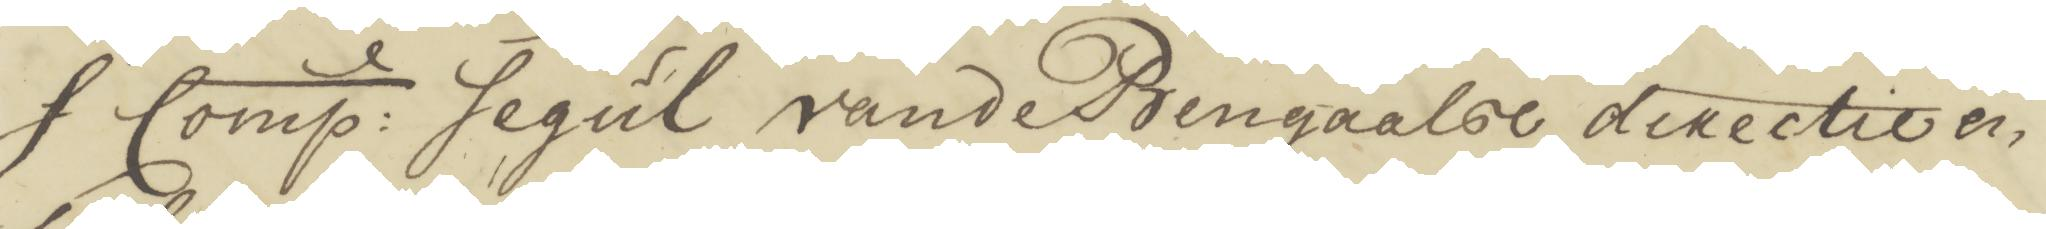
s Comp:e segul van de Bengaalse directie en
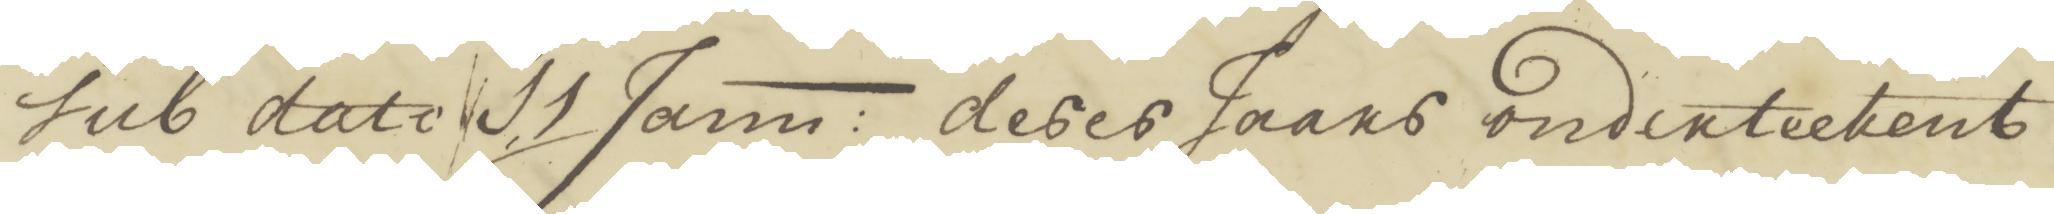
sub dato 11 Jann: deses Jaars onderteekent
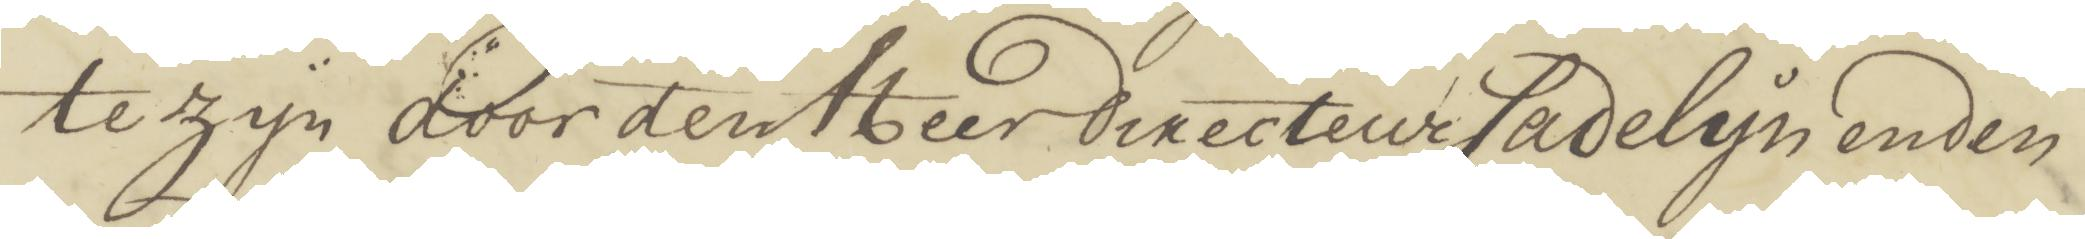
te zijn door den Heer directeur sadelijn en den
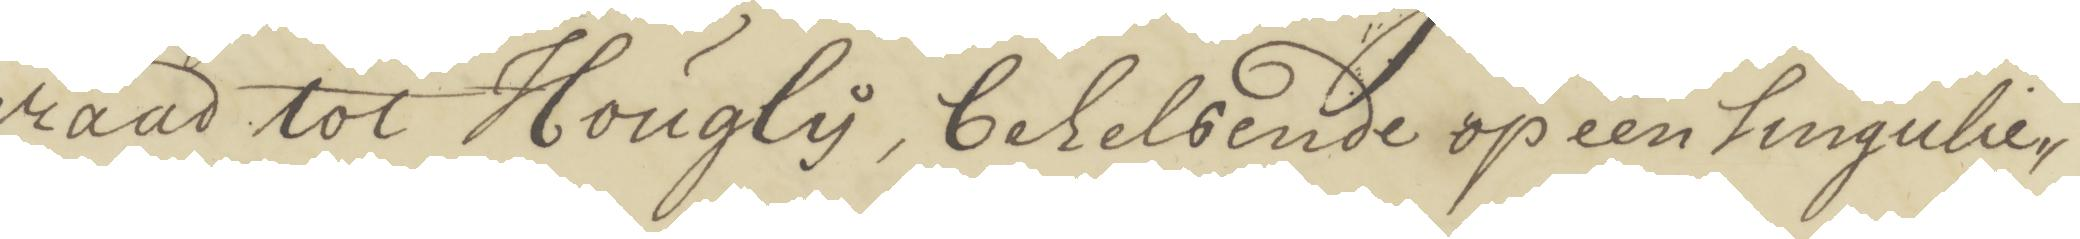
raad tot Houglij, behelsende op een singulie„
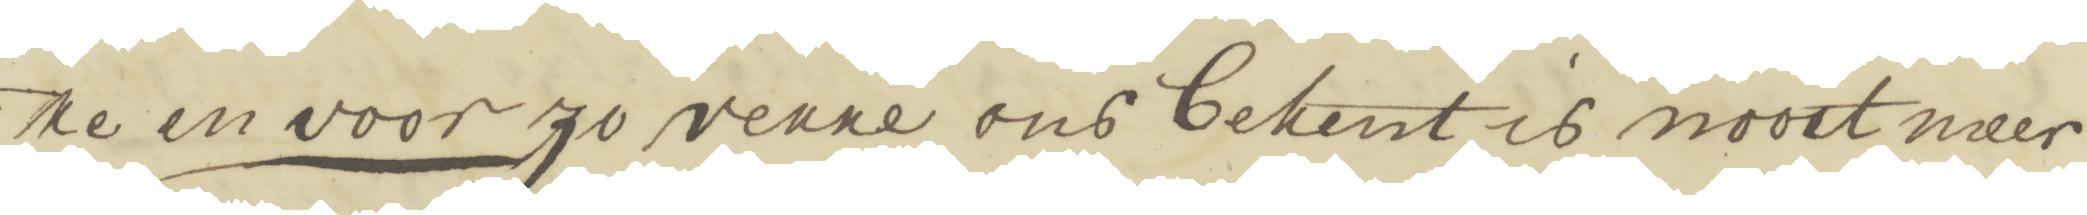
re en voor zo verre ons bekent is nooit meer
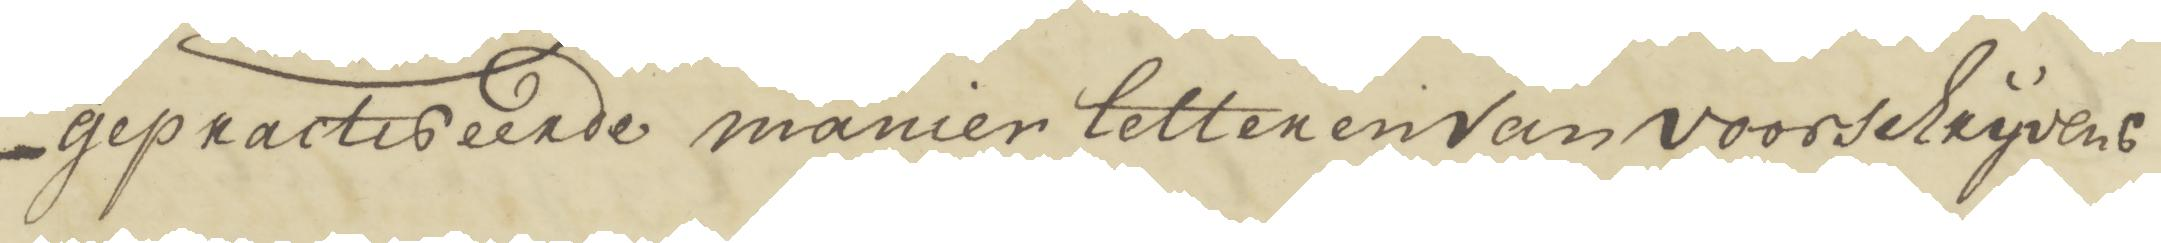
gepractiseerde manier letteren van voorschrijvens
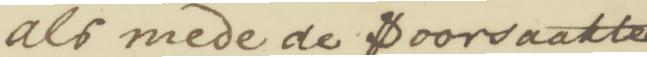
als mede de veroorsaakte
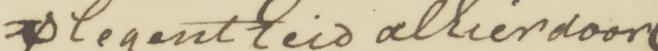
verlegentheid alhier door
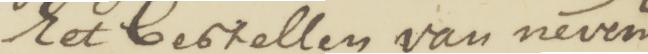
het bestellen van nevens
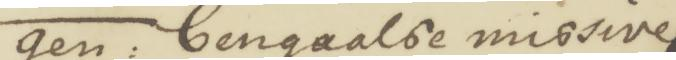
gen: bengaalse missive
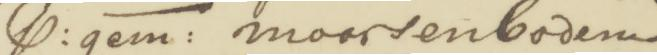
p:r gem: moorsen bodem
